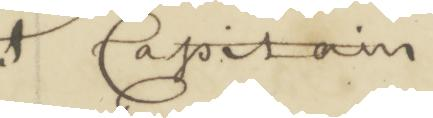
1 Capitain
